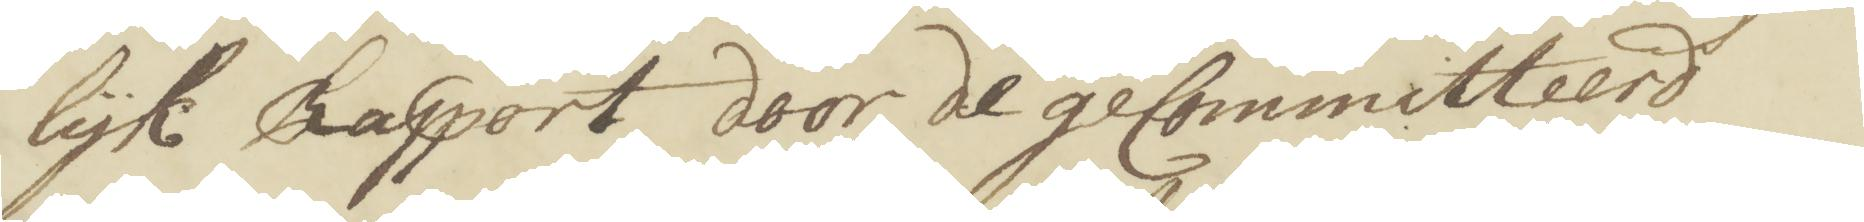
lijk Rapport door de gecommitteerds
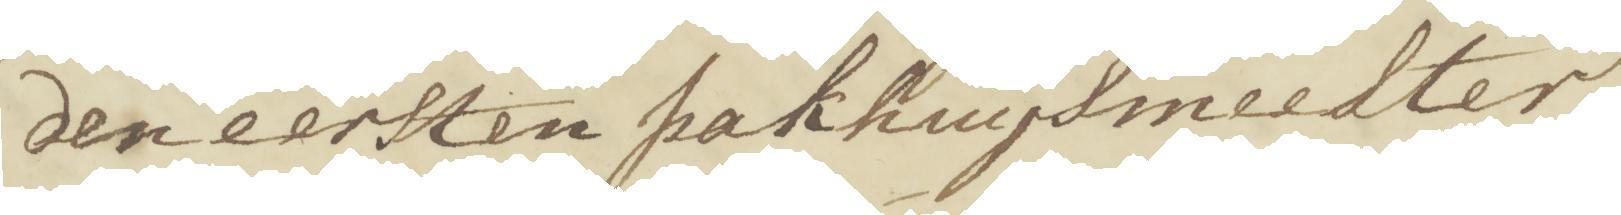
den eersten pakhuijsmeester
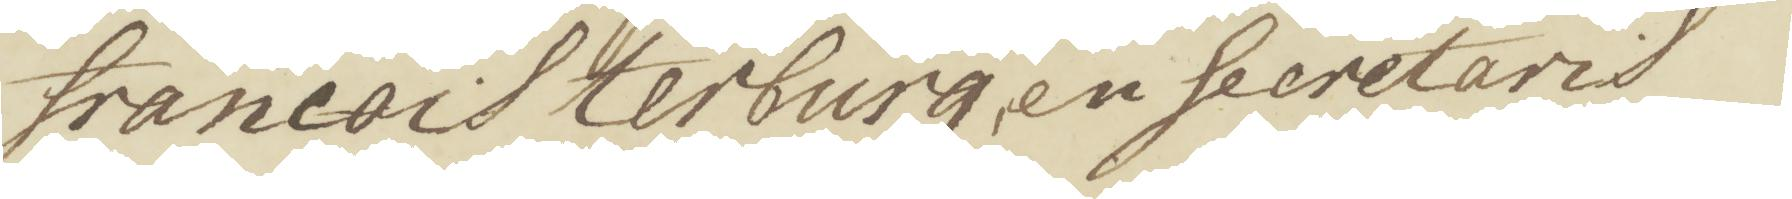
francois terburg, en secretaris
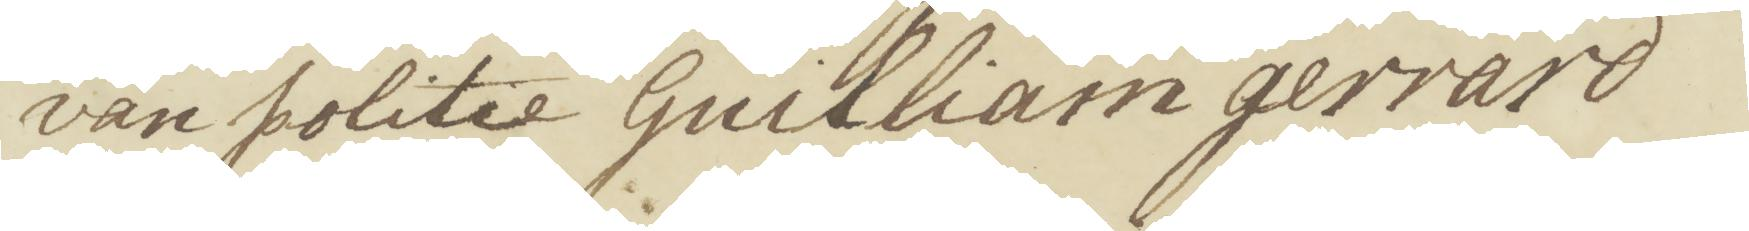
van politie Guilliam gerrard
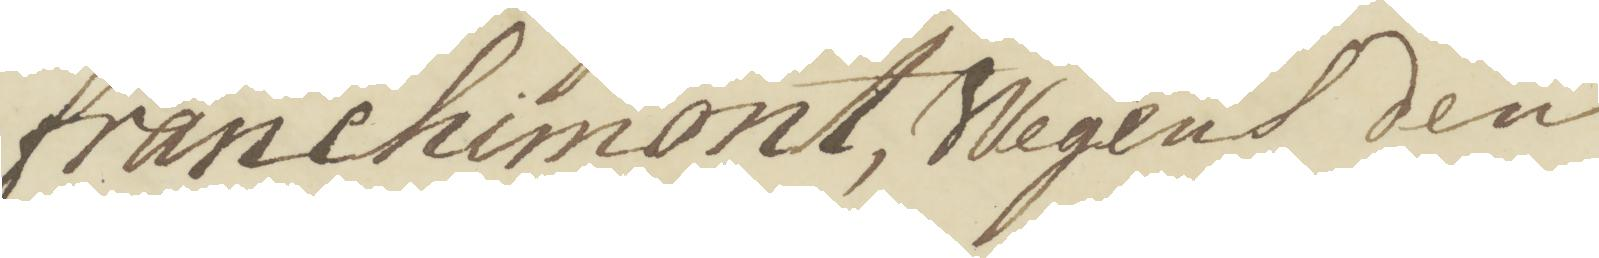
franchimont, wegens den
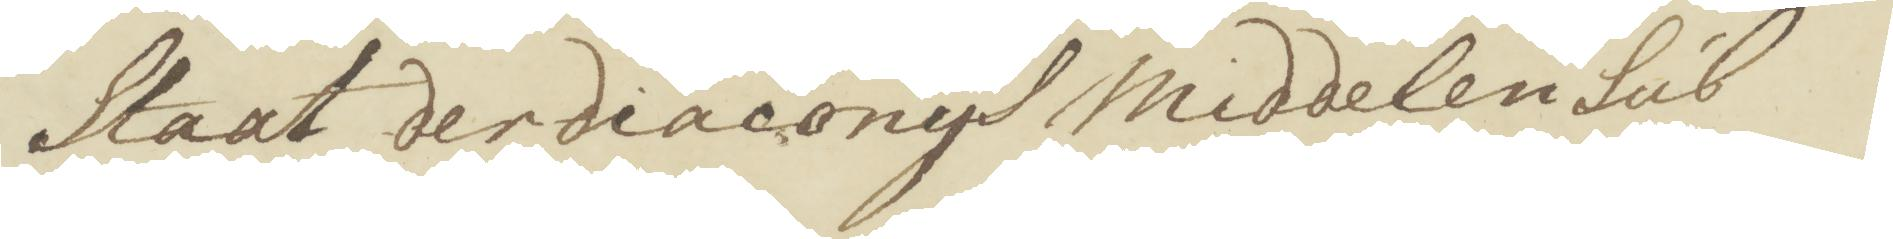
staat der diaconijs middelen sub
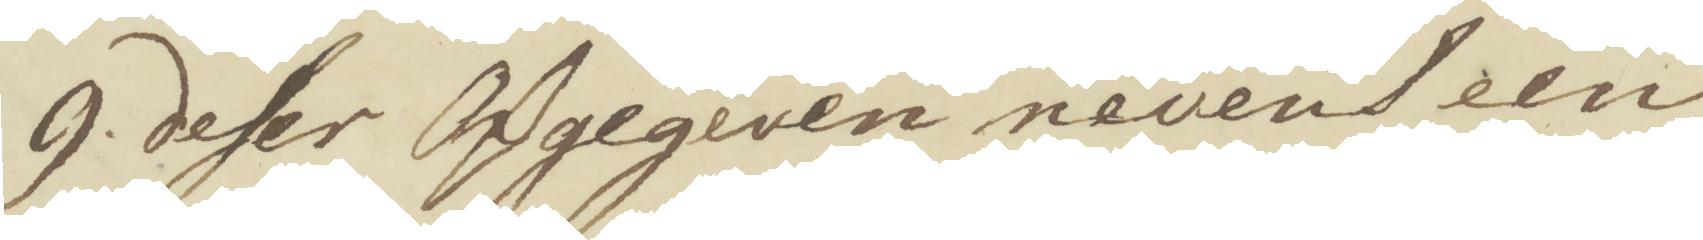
9. deser overgegeven nevens een
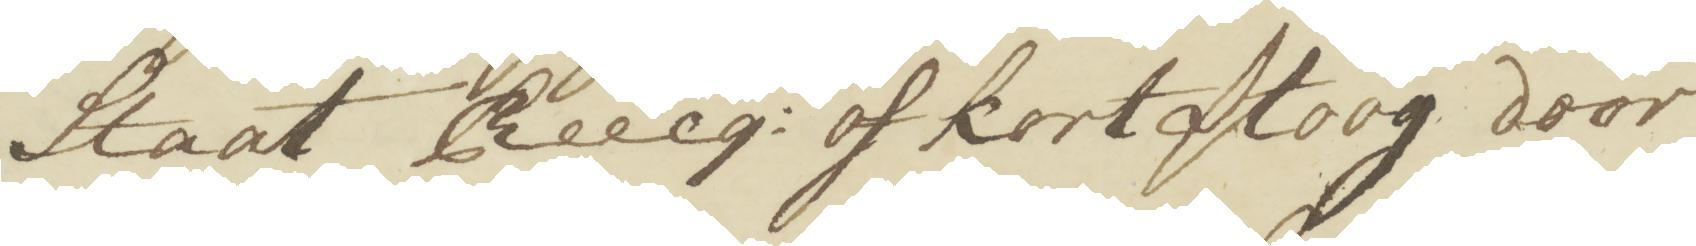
staat Reecq: of kort vertoog door
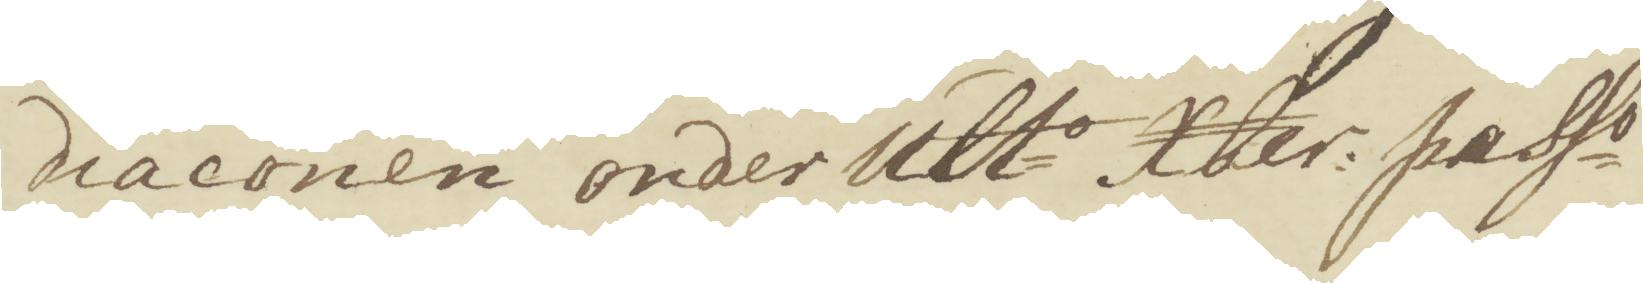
diaconen onder ult=o xber: pass=o
